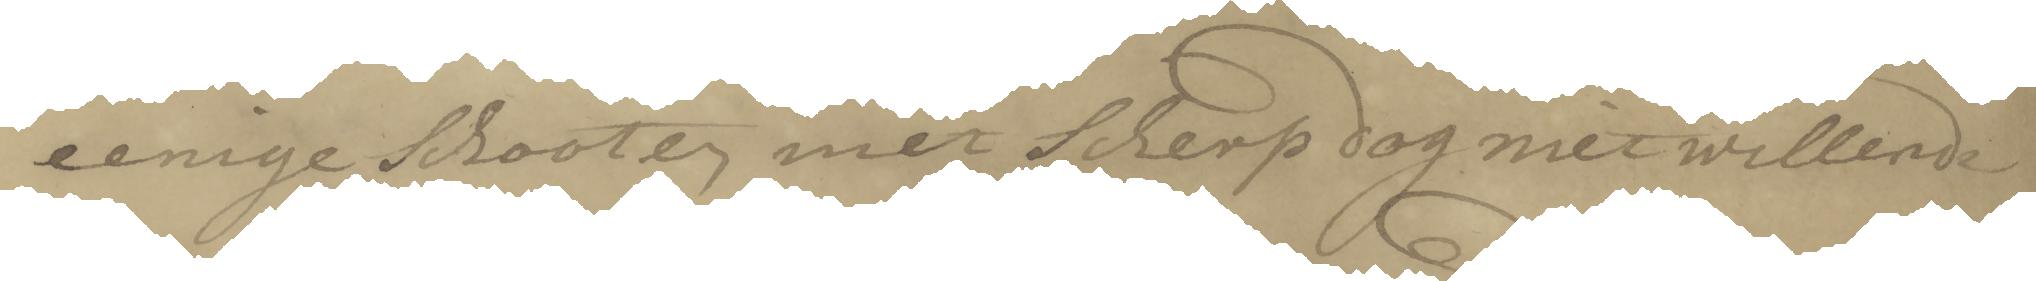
eenige schooten met scherp dog niet willende
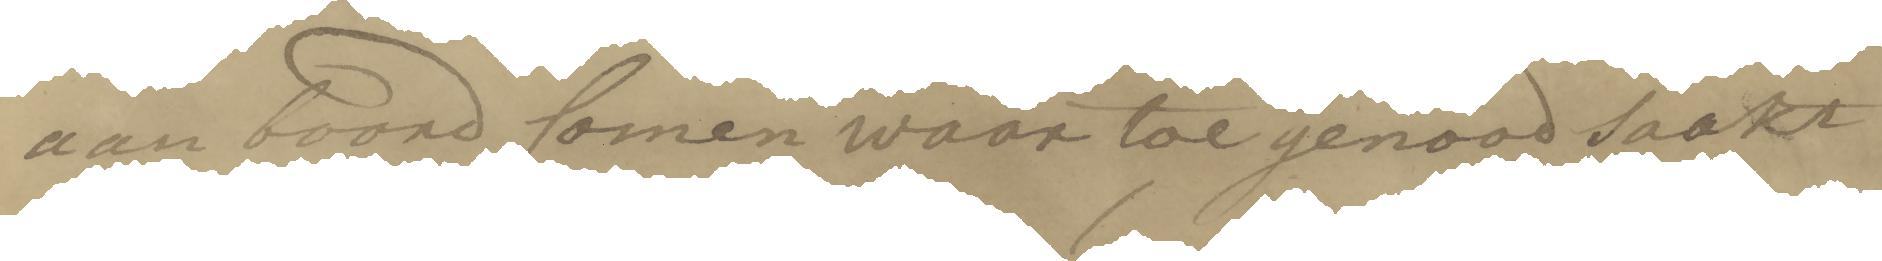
aan boord Comen waar toe genood saakt
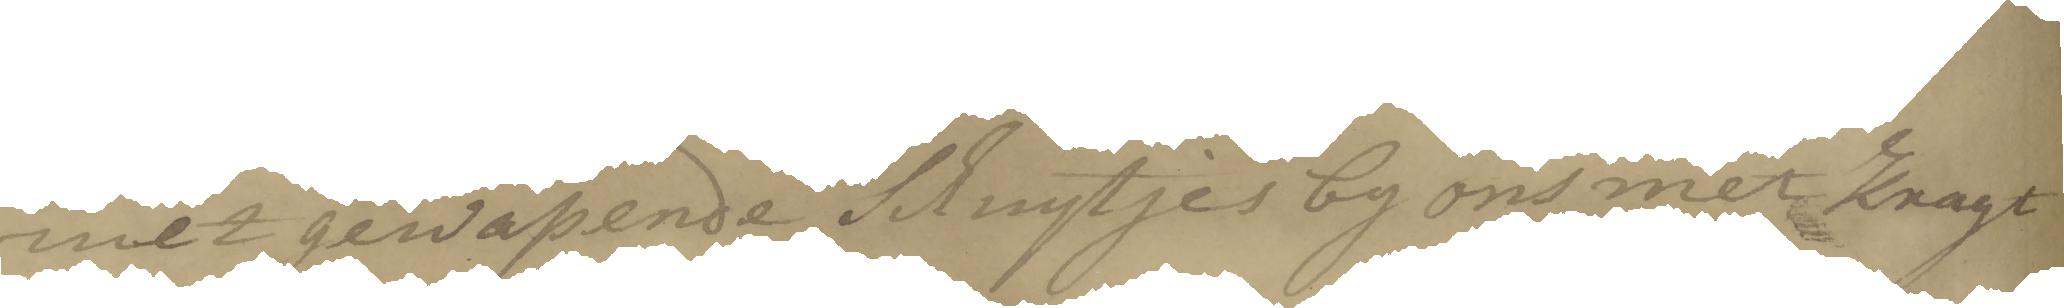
met gewapende schuytjes by ons met kragt
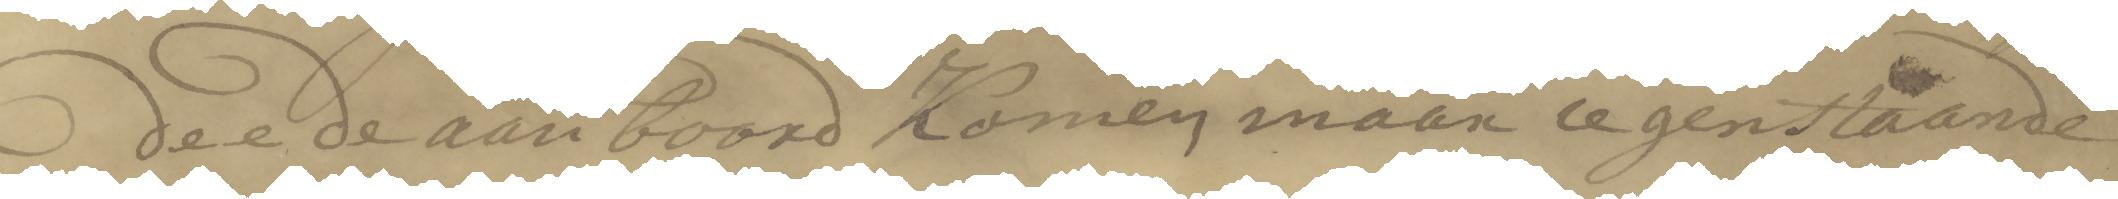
deede aan boord komen maar tegenstaande
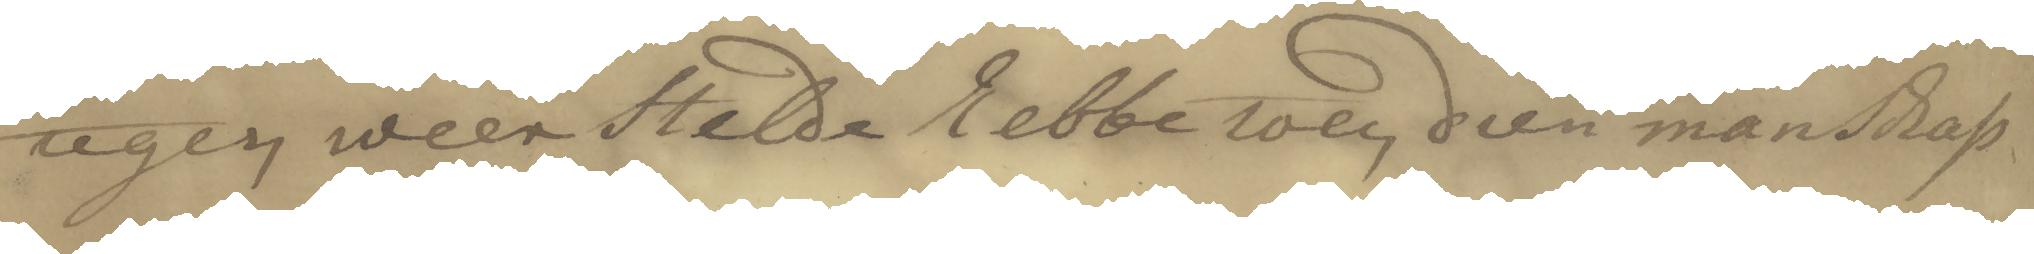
tegen weer stelde hebbe toen dien manschap„
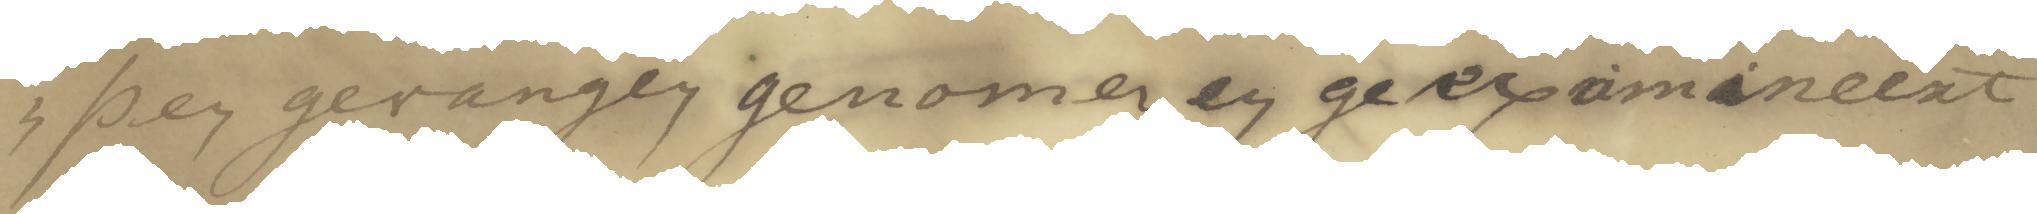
„pen gerangen genomen en geexamineert
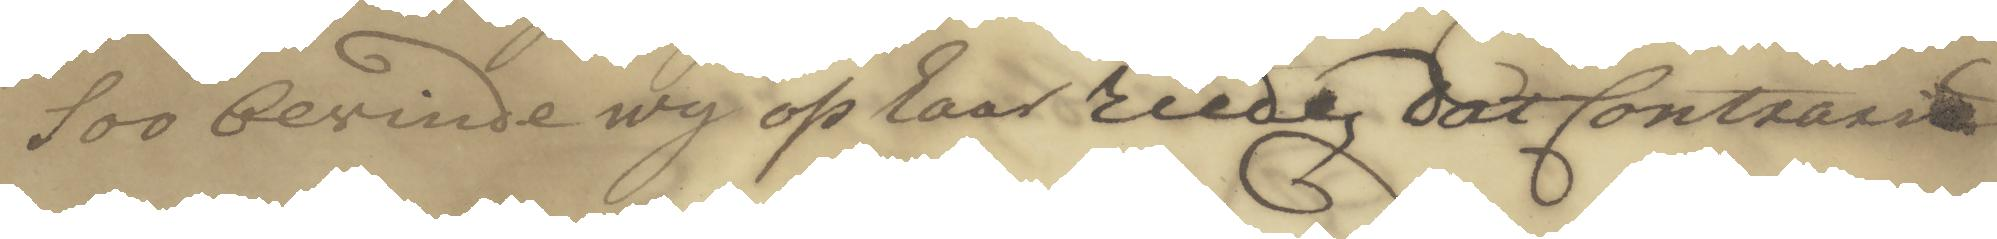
soo bevinde wy op haar reeden dat Contrarie
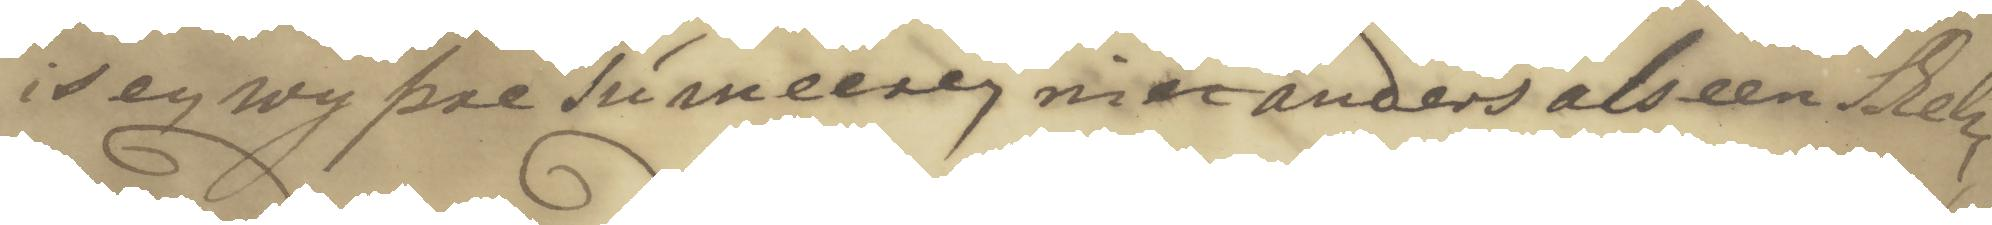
is en wy presumeeren niet anders als een schelm
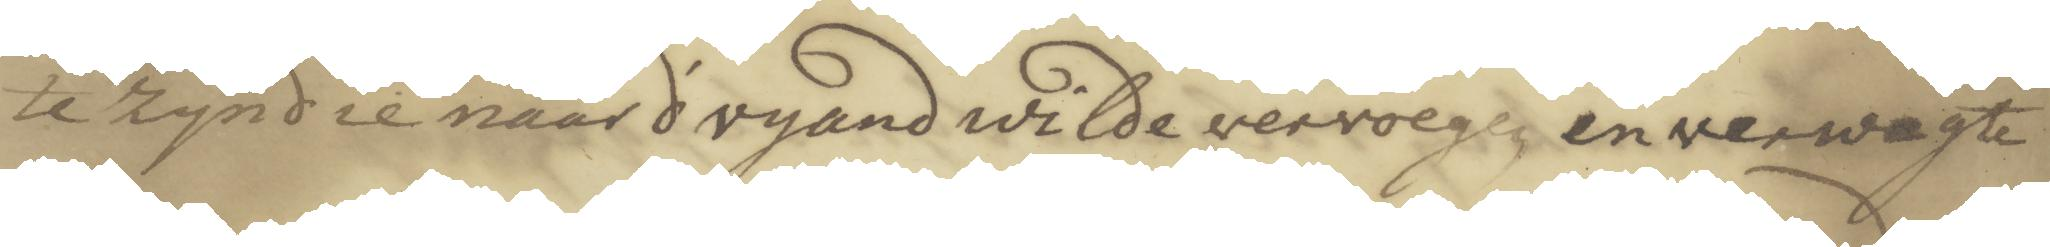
te zyn die naar d’ vyand wilde vervoegen en verwagte
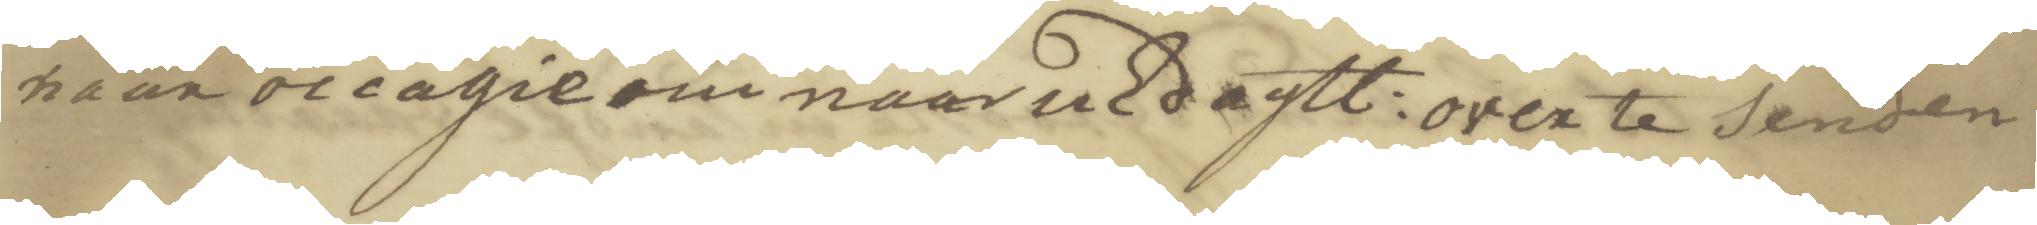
naar occagie om naar uEd agtb: over te senden
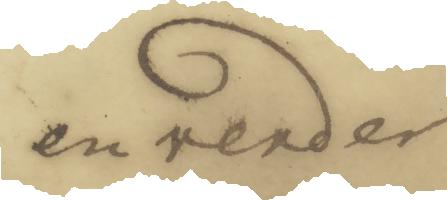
en verder
